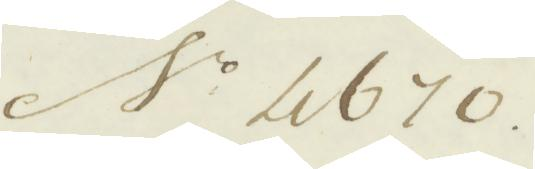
N:o 4670.
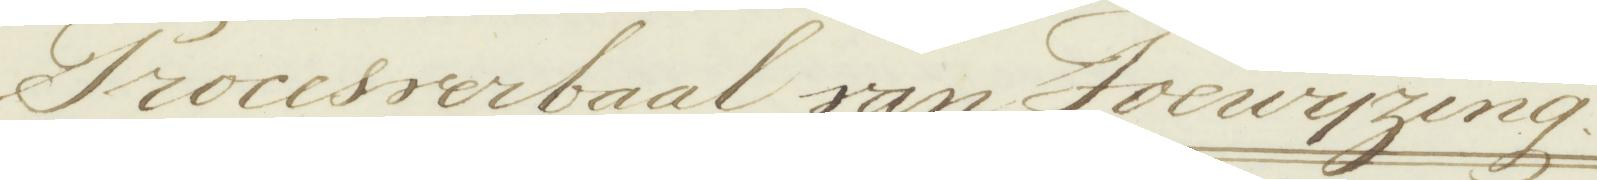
Procesverbaal van Toewyzing.
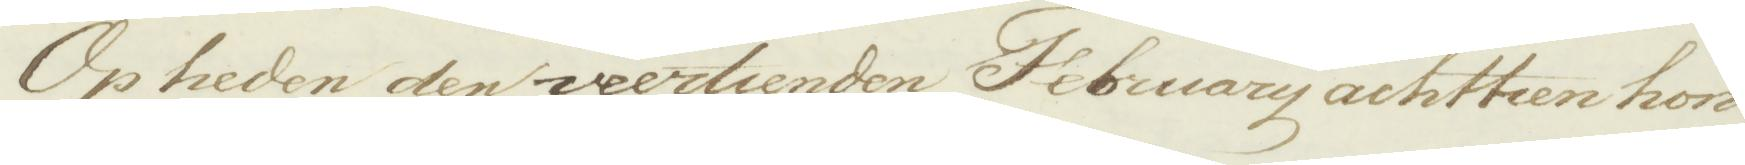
Op heden den veertienden February achttien hon
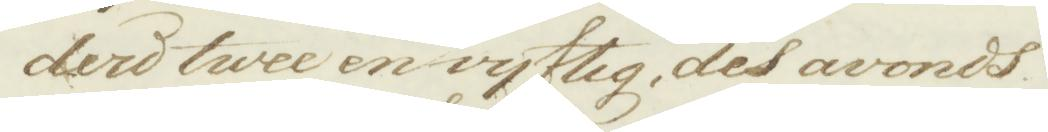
derd twee en vyftig, des avonds.
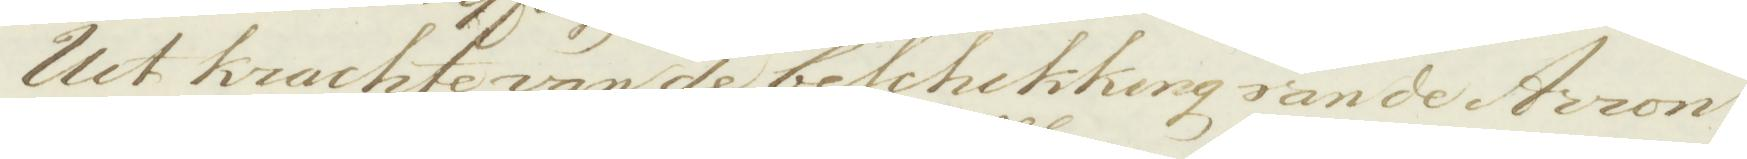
Uit krachte van de beschikking van de Arron
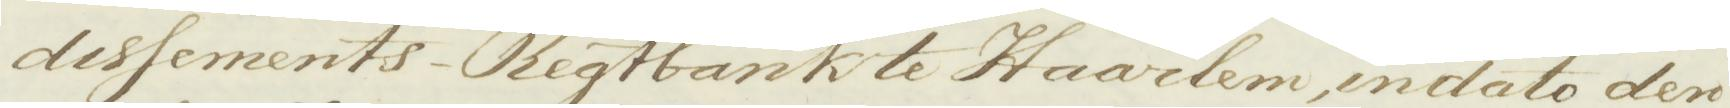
dissements-Regtbank te Haarlem, in dato den
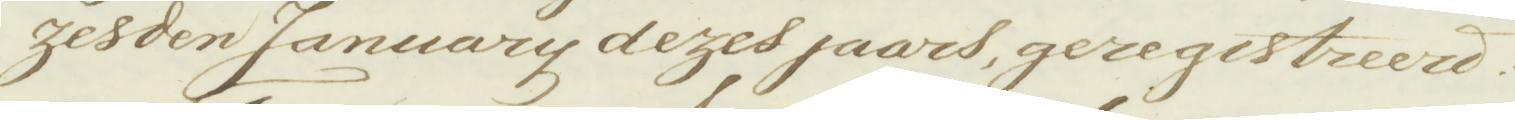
zesden January dezes jaars, geregistreerd.
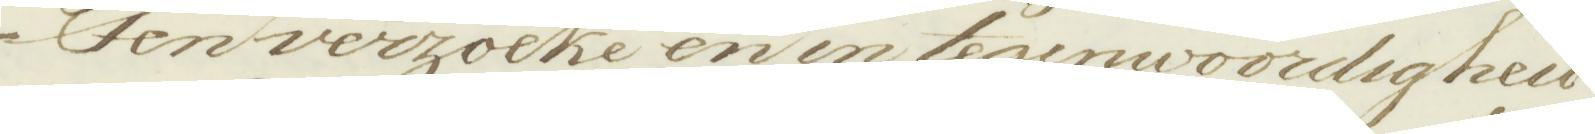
— Ten verzoeke en in tegenwoordigheid
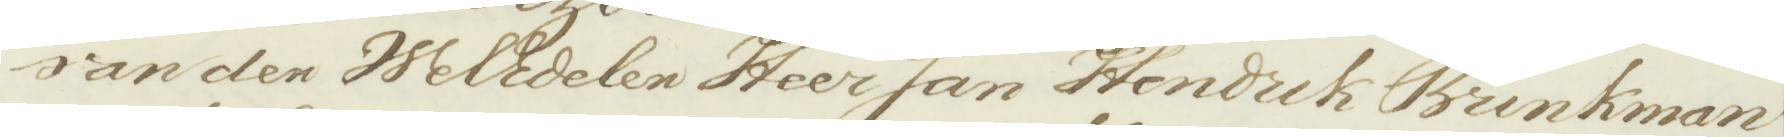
van den WelEdelen Heer Jan Hendrik Brinkman,
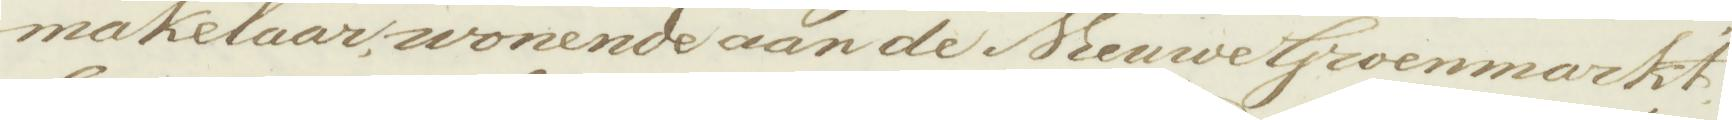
makelaar, wonende aan de Nieuwe Groenmarkt,
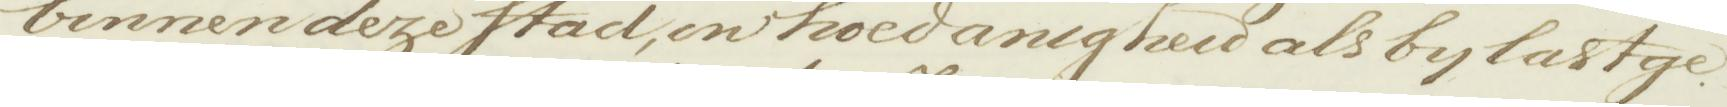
binnen deze stad, en hoedanigheid als by lastge.
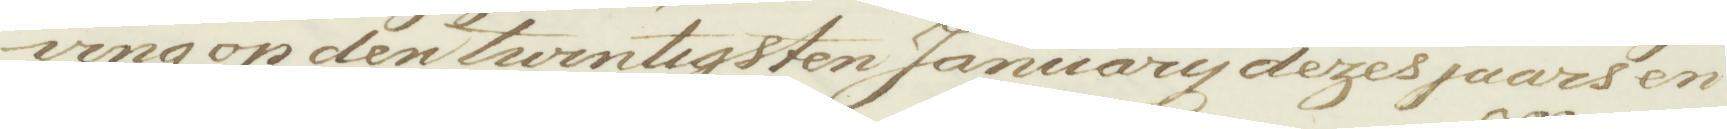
ving op den twintigsten January dezes jaars en
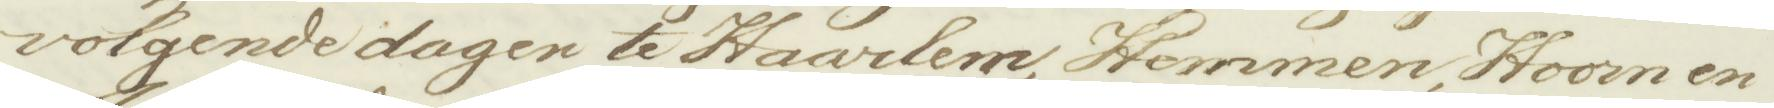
volgende dagen te Haarlem, Hemmen, Hoorn en
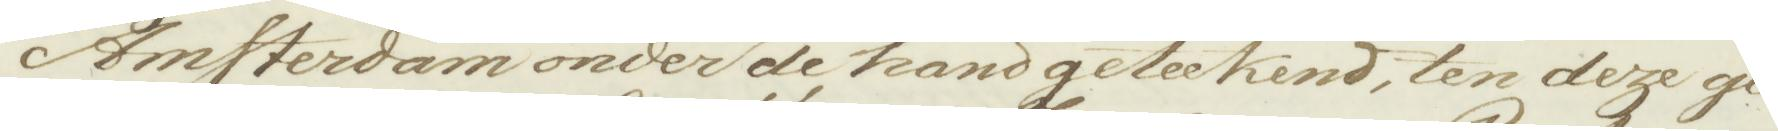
Amsterdam onder de hand geteekend, ten deze ge
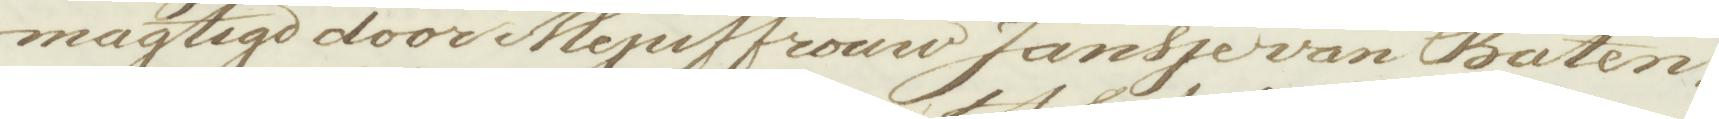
magtigd door Mejuffrouw Jansje van Baten,
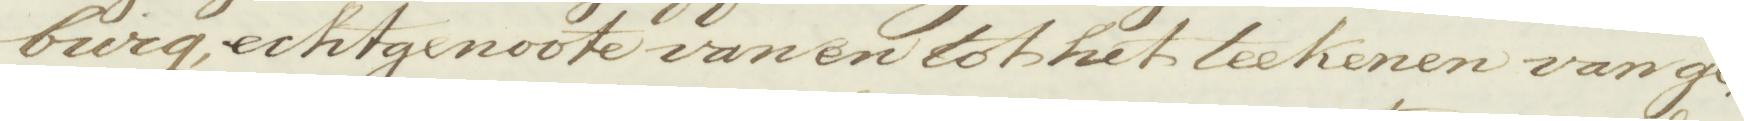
burg, echtgenoote van en tot het teekenen van ge,
